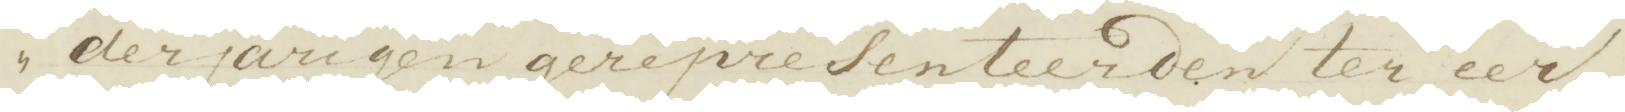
„ derjarigen gerepresenteerden ter eer
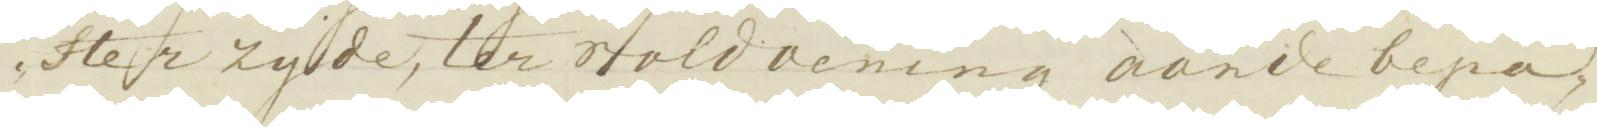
„ster zijde, ter voldoening aande bepa„
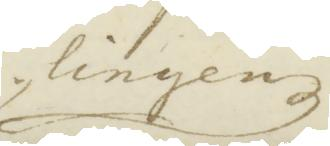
„lingen
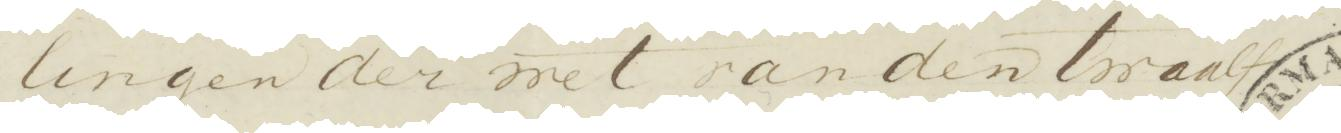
lingen der wet van den twaalf
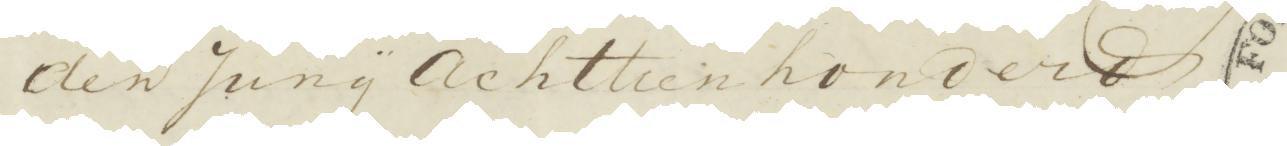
den Junij Achttienhonderd,
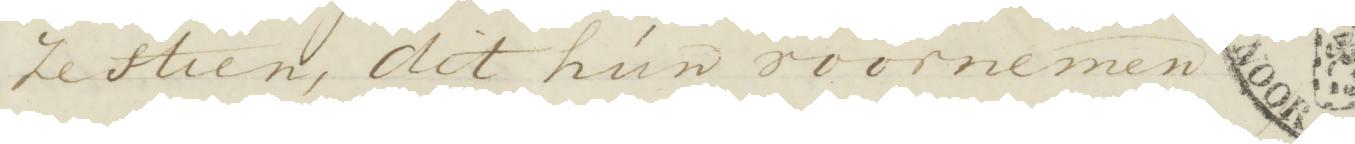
zestien, dit hun voornemen
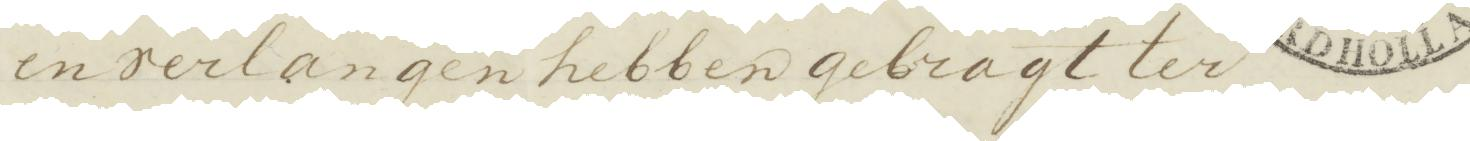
en verlangen hebben gebragt ter
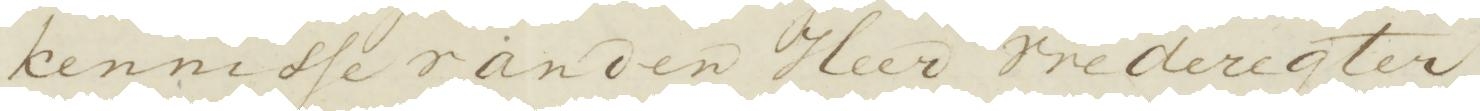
kennisse van den Heer Vrederegter
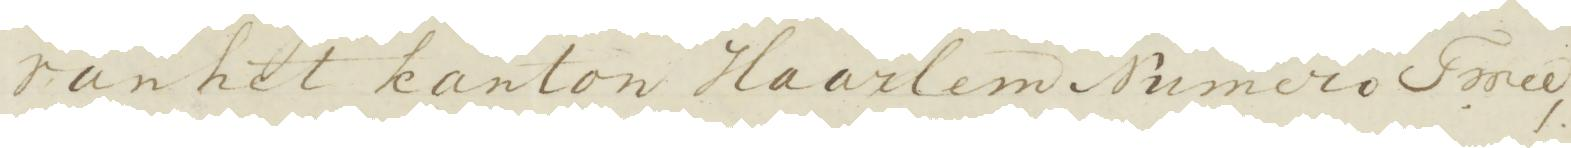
van het kanton Haarlem Numero Twee,
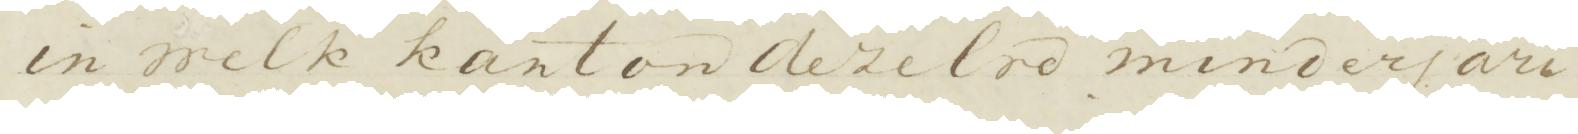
in welk kanton dezelve minderjari
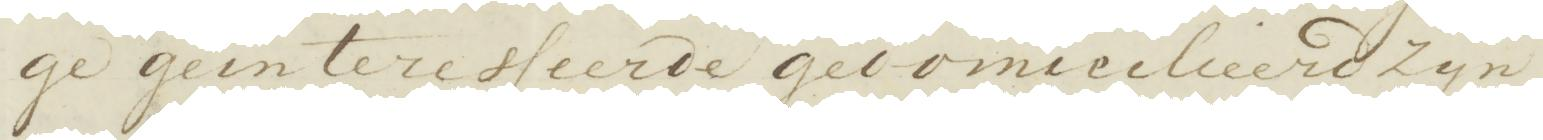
ge geinteresseerde gedomicilieerd zijn
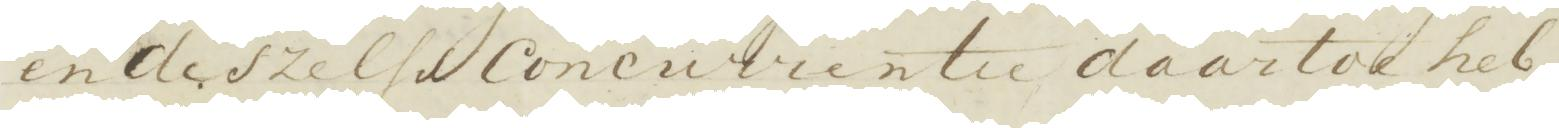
en deszelfs concurrentie daar toe heb
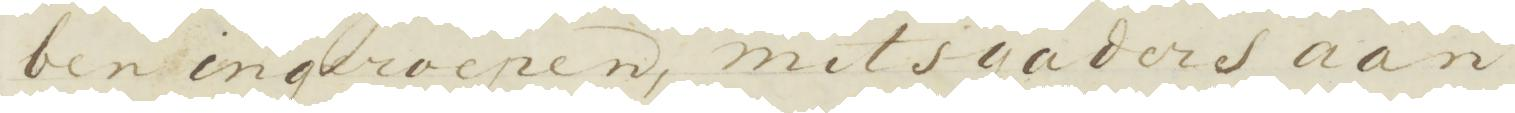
ben ingeroepen, mitsgaders aan
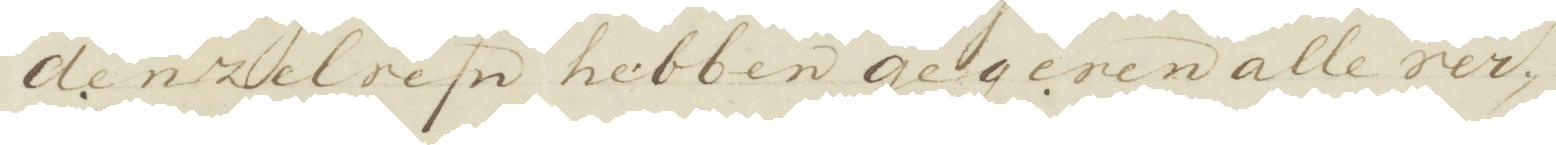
denzelven hebben gegeven alle ver„
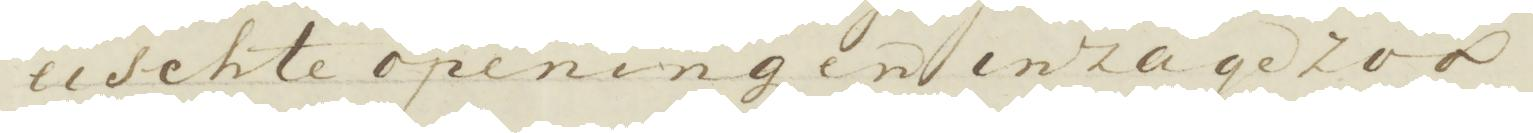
eischte opening en inzage zoo
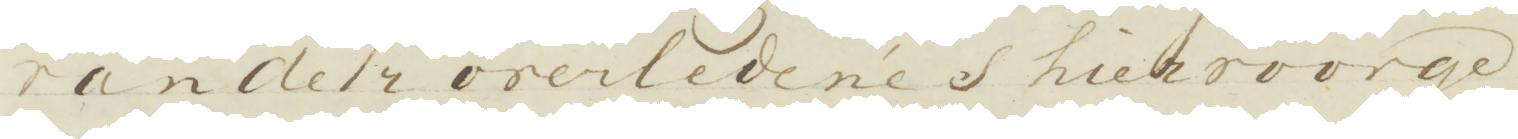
van der overledenes hiervoorge
